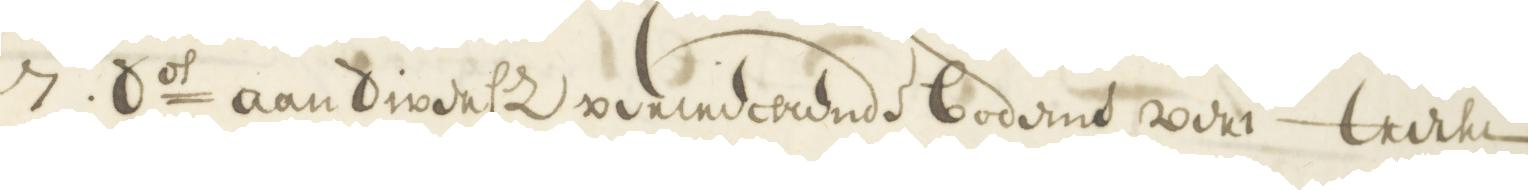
7. d=os aan diversz verireckende bodems verstreckt
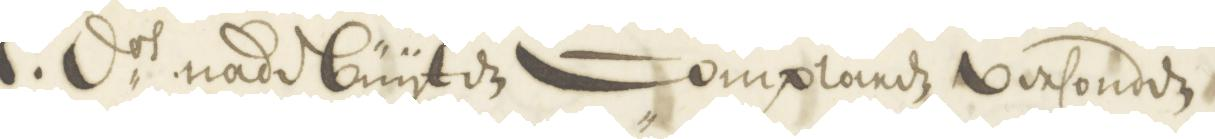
5. d=os nade buijten Comptoiren versonden
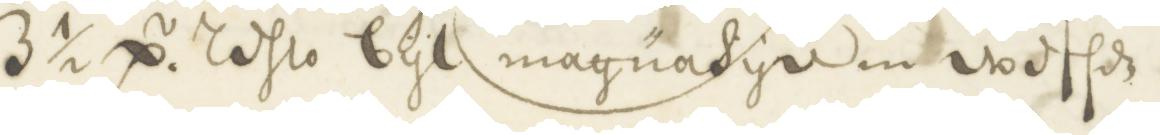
3½ p.e resto bijt maguasije in wesen
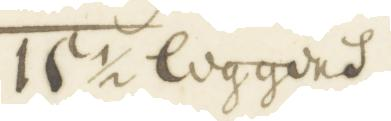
15½ leggers
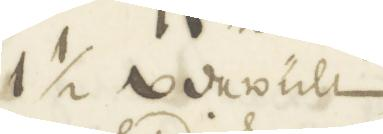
1½ vervult
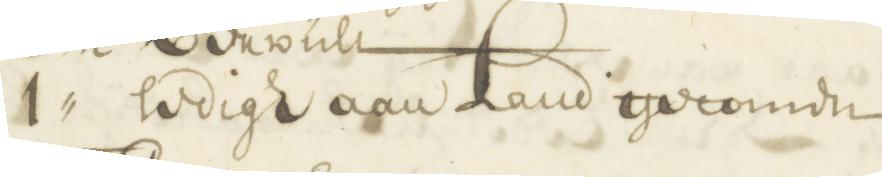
1„ ledigh aan Land gecomen
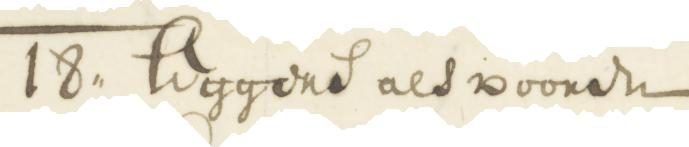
18„ leggers als vooren
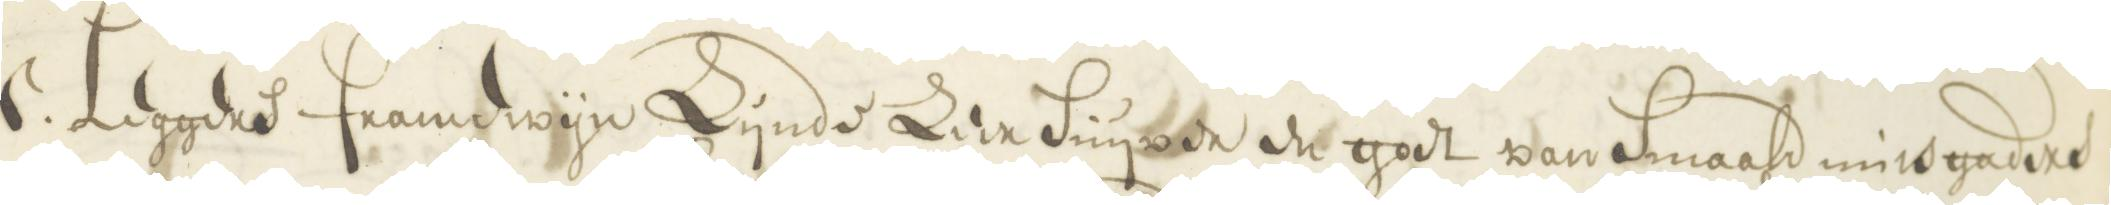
5. Leggers francewijn zijnde zeer suijver en goet van smaalk mitsgaders
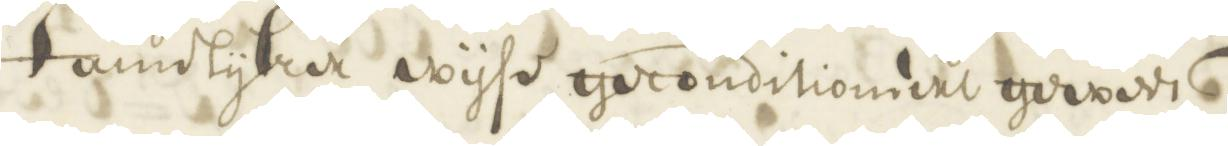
tamelijker wijse geconditioneert geweest
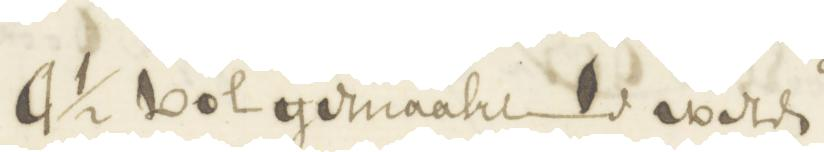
4½ volgemaakt te wesen
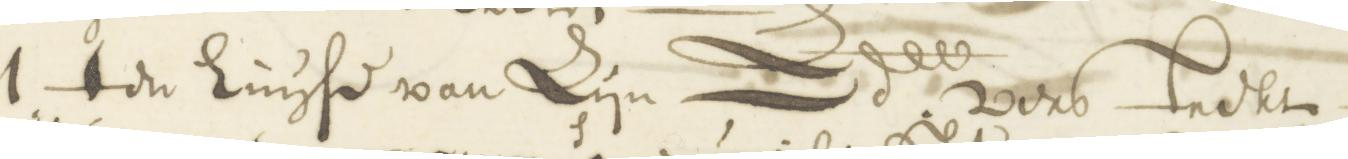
1 ten huijse van zijn Ed verstrekt
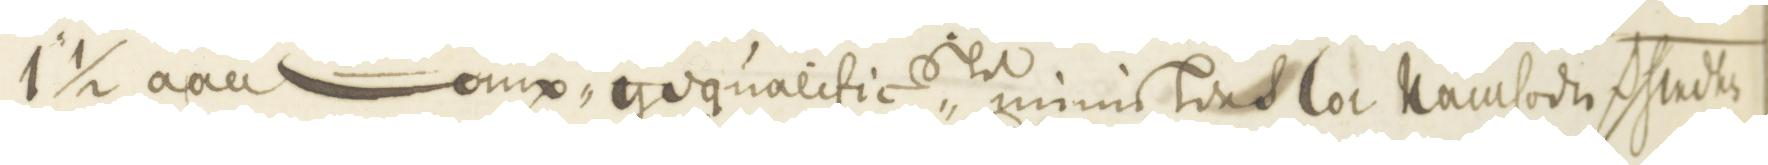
1½ aan Comp„s gequalific„sten ministers tot rantsoen verstreken
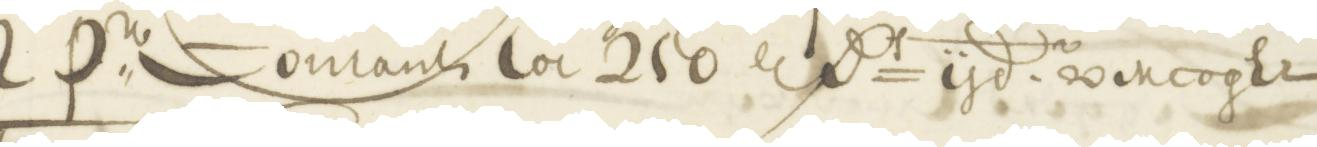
2 p„r Comant tot 250 RE=s ijd„r vercoght
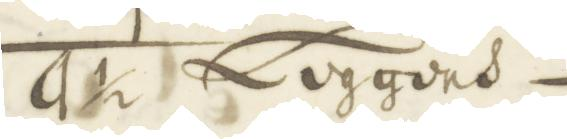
4½ Leggers
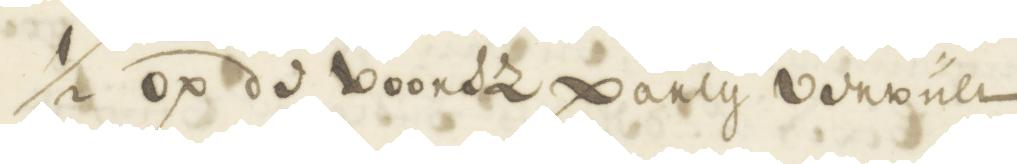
½ op de voorsz: partij vervult
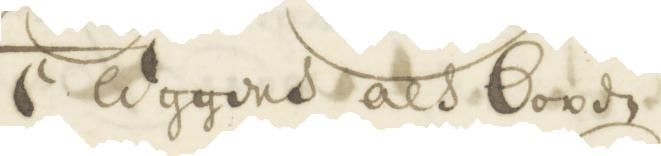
5 leggers als boven
